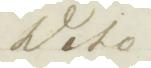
Dito . . . . . . . . .
